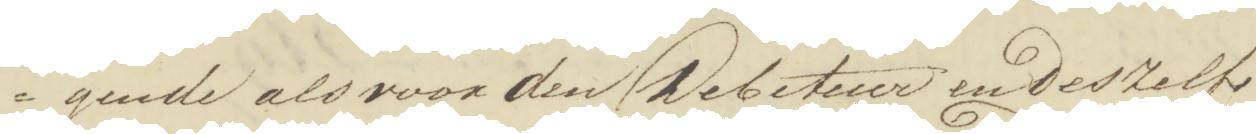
„gende als voor den Debiteur en deszelfs
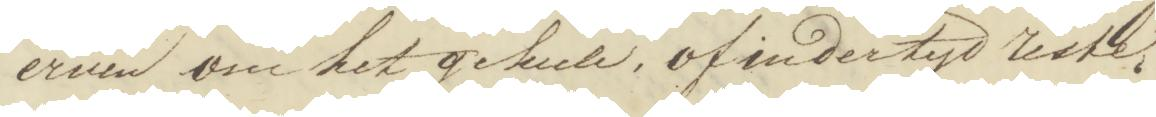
erven om het geheele, of indertyd reste„
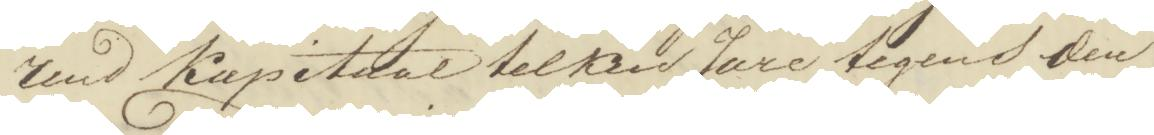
rend kapitaal telken Jare tegens den
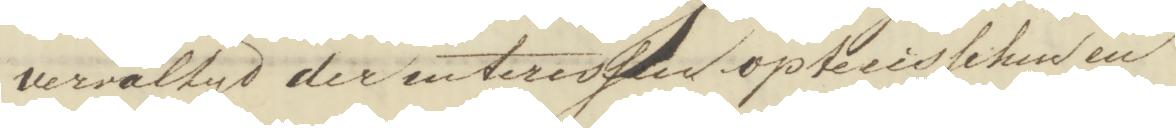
vervaltyd der interessen op te eisschen en
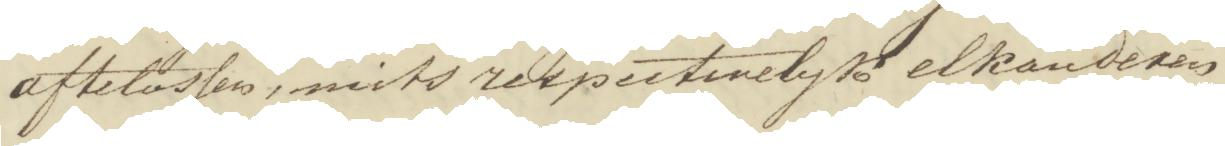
af te lossen, mits respectivelyk elkanderen
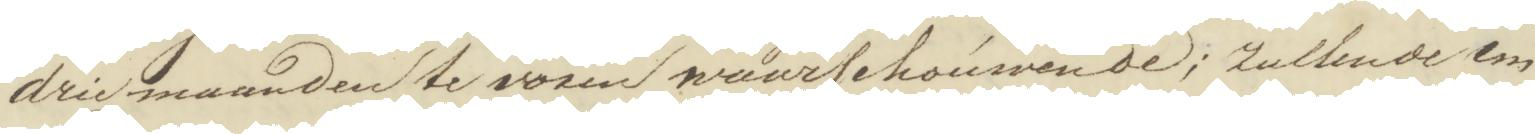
drie maanden te voren waarschouwende; zullende im
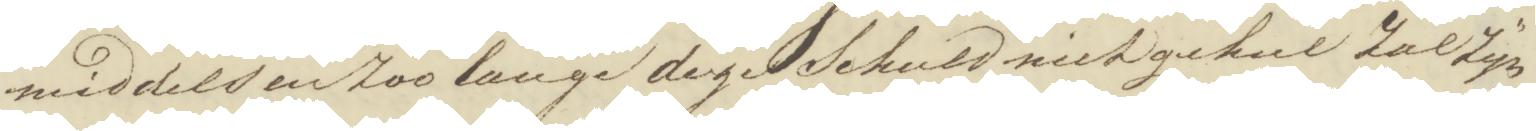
middels en zoo lange deze schuld niet geheel zal zyn
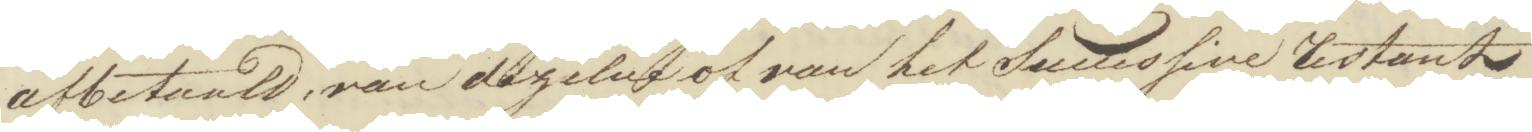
afbetaald, van dezelve of van het successive restant
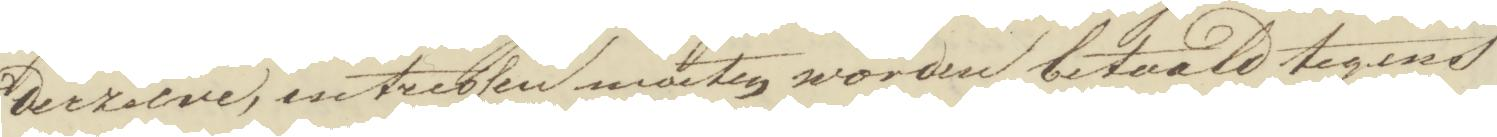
derzelve, intressen moeten worden betaald tegens
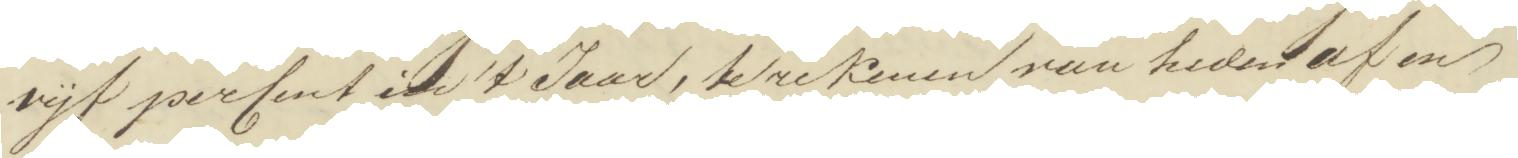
vijf percent in ’t Iaar, te rekenen van heden af en
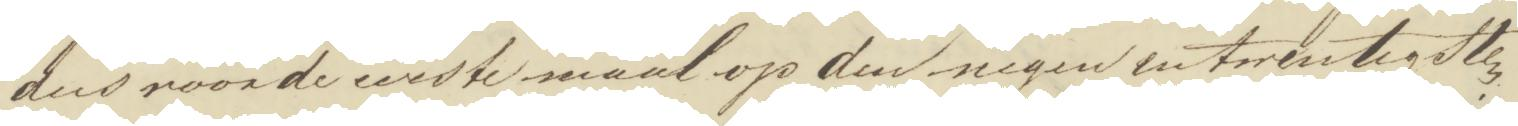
dus voor de eerste maal op den negen en twintigsten
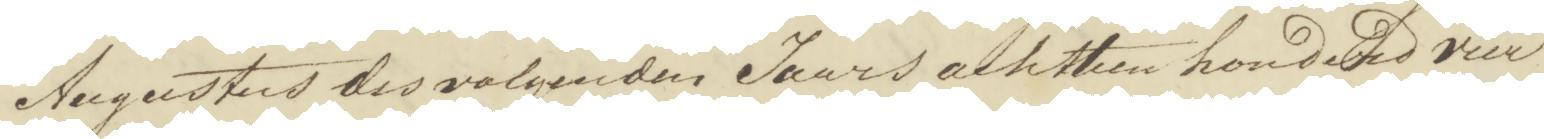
Augusteus des volgenden Iaars achttien honderd vier
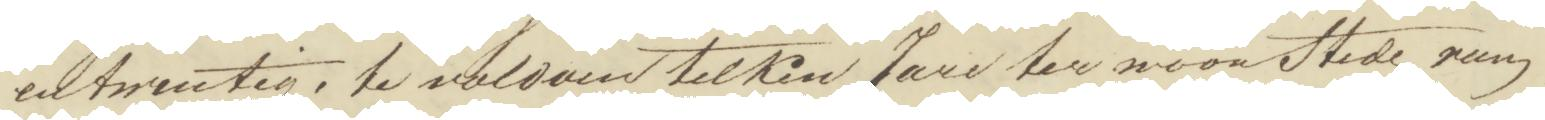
en twintig, te voldoen telken Jare ter woonstede van
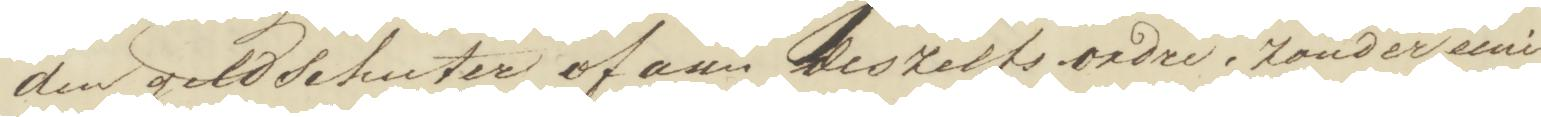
den geldschieter of aan deszelfs ordre, zonder eeni
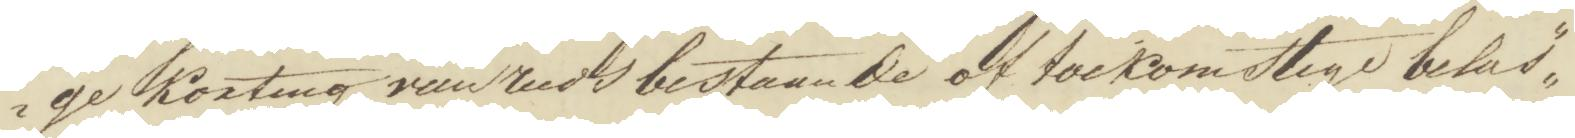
„ge korting van reeds bestaande of toekomstige belas„
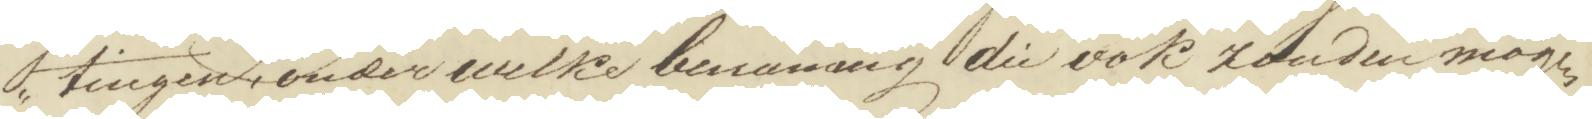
„tingen, onder welke benaming die ook zouden mogen
